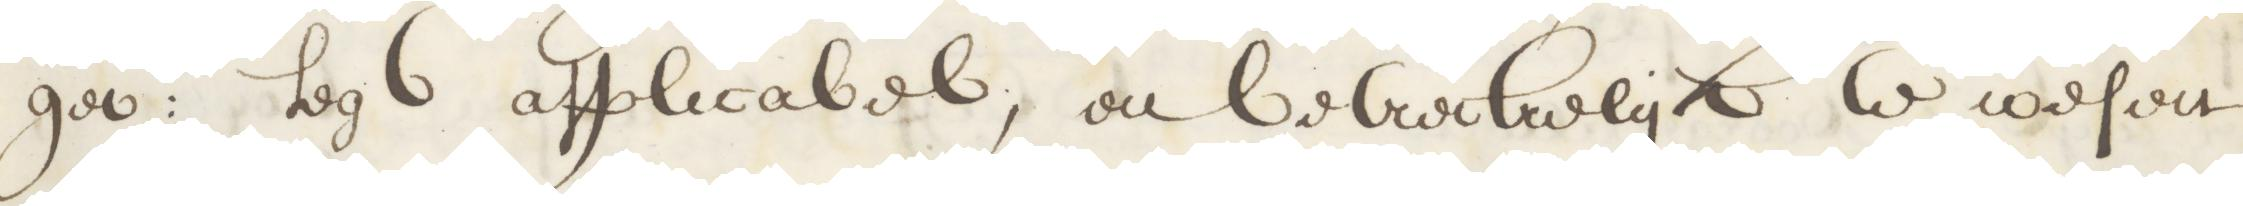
gev: legt applicabel, en betreckelijk te wesen
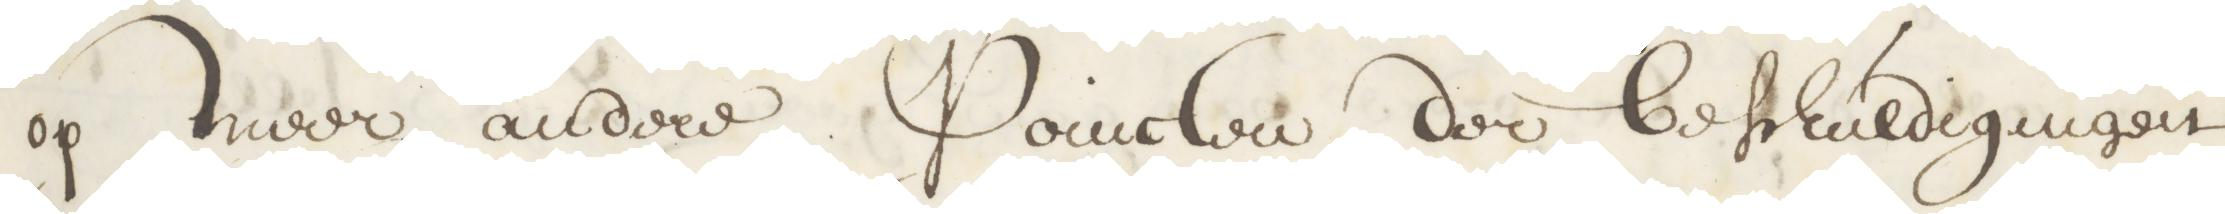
op meer andere Poincten der beschuldigingen
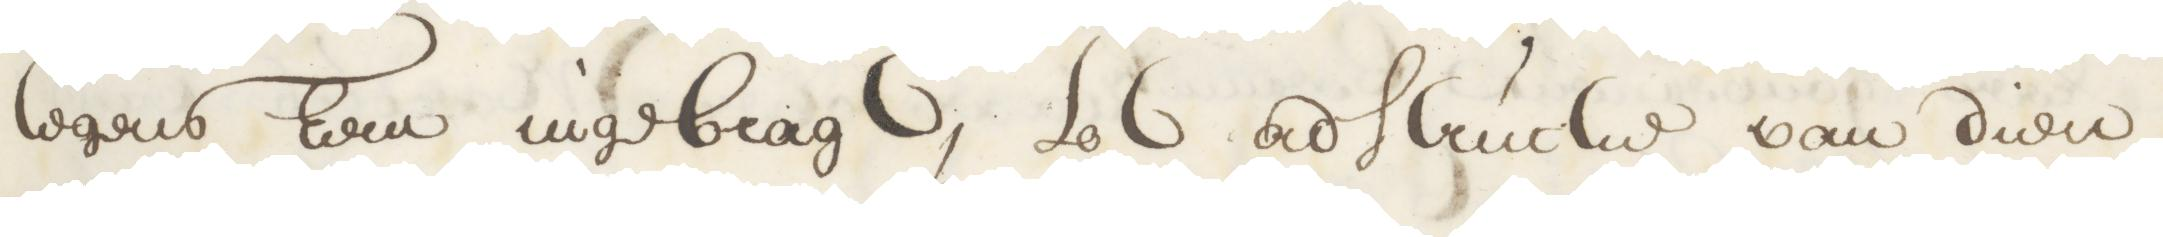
tegens hem ingebragt, tot adstructie van dien
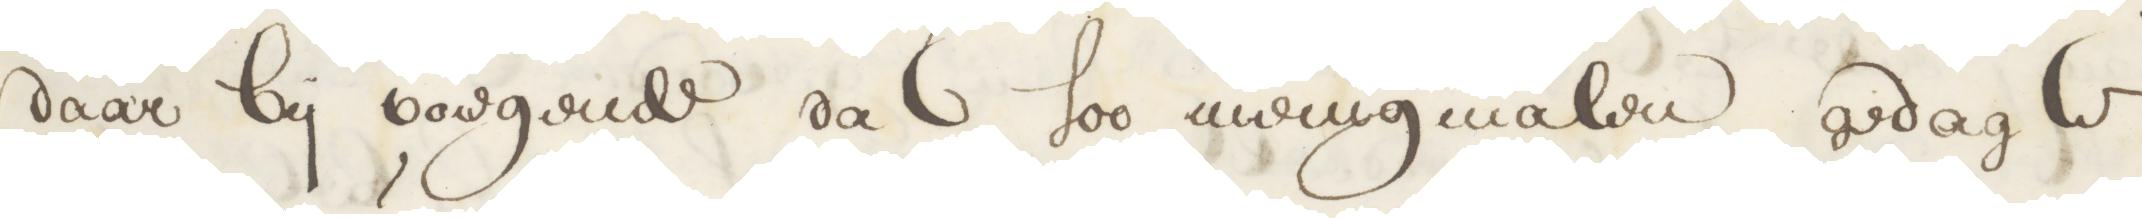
daar bij voegende dat soo menig malen gedag te
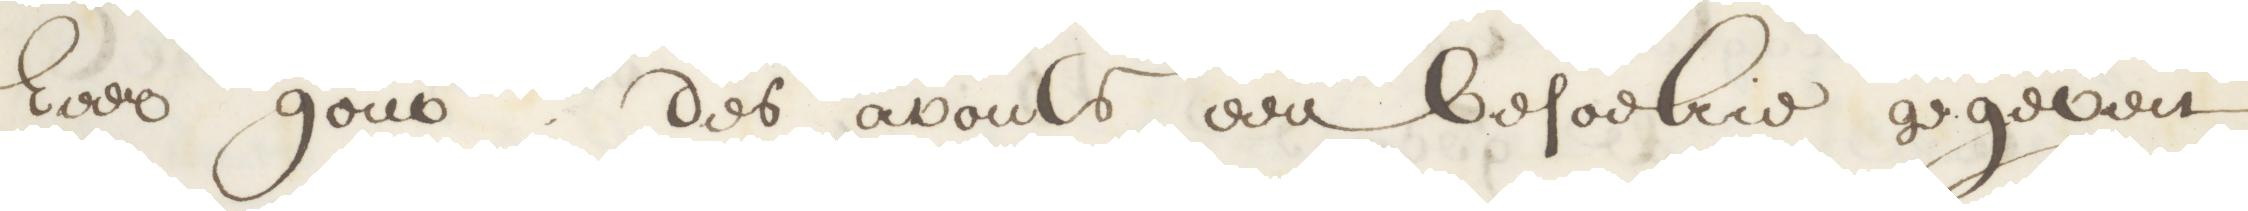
heer gouv:r des avonts een besoekie gegeven
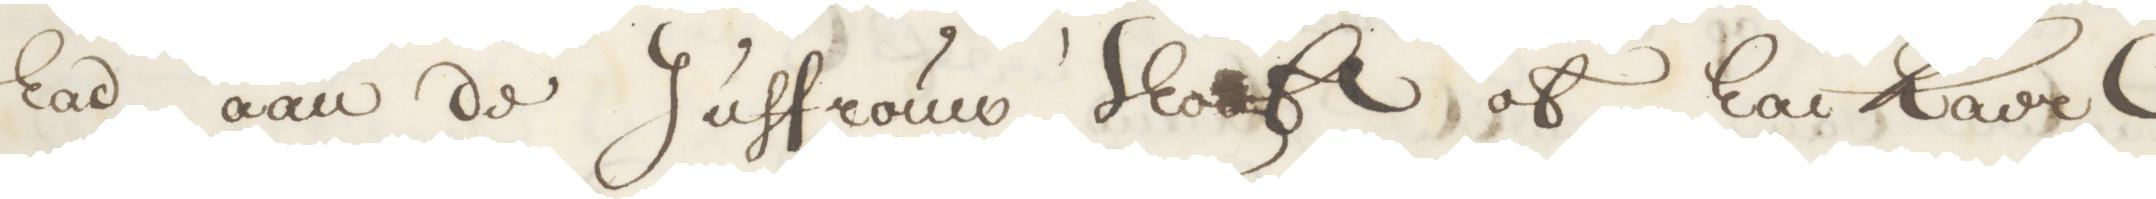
had, aan de Juffrouw 'thooft of hackaert
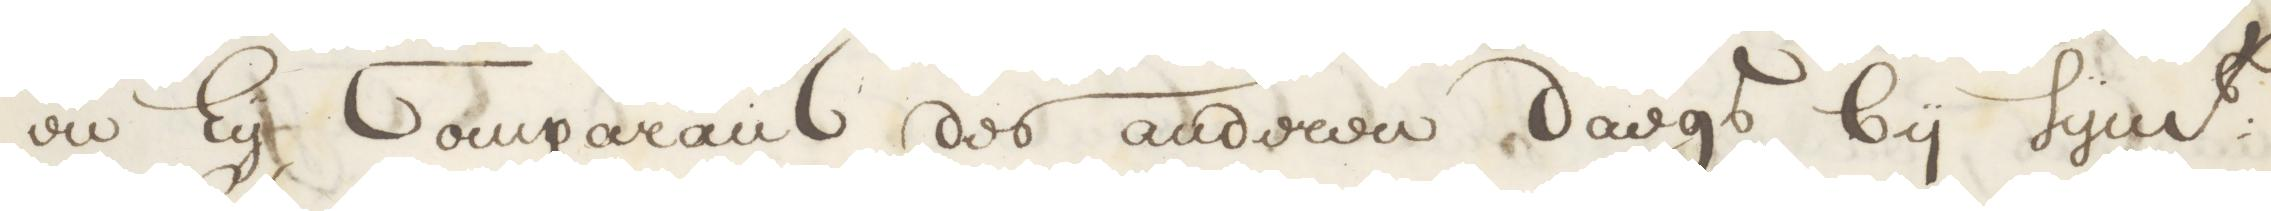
en hij Comparant des anderen daegs bij sijn E:
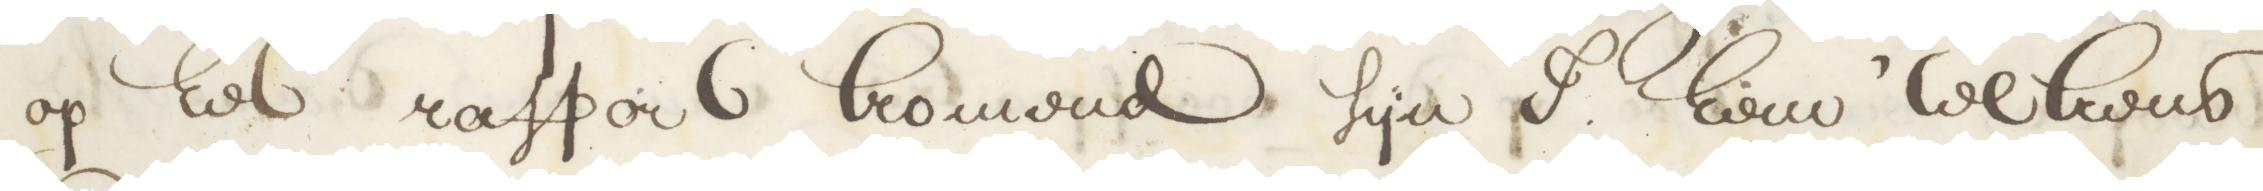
op het rapport komend sijn E. hem 'telkens
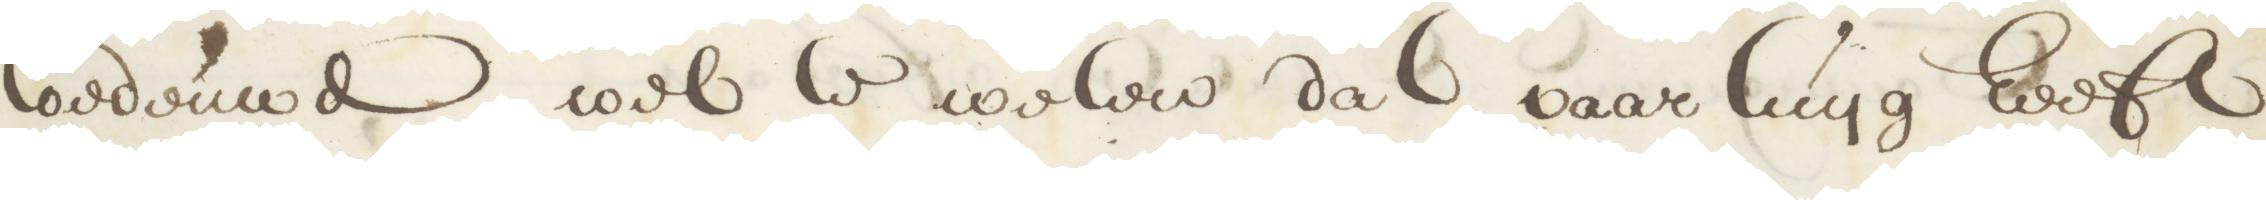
toedeuwde wel te weten dat vaartuijg heeft
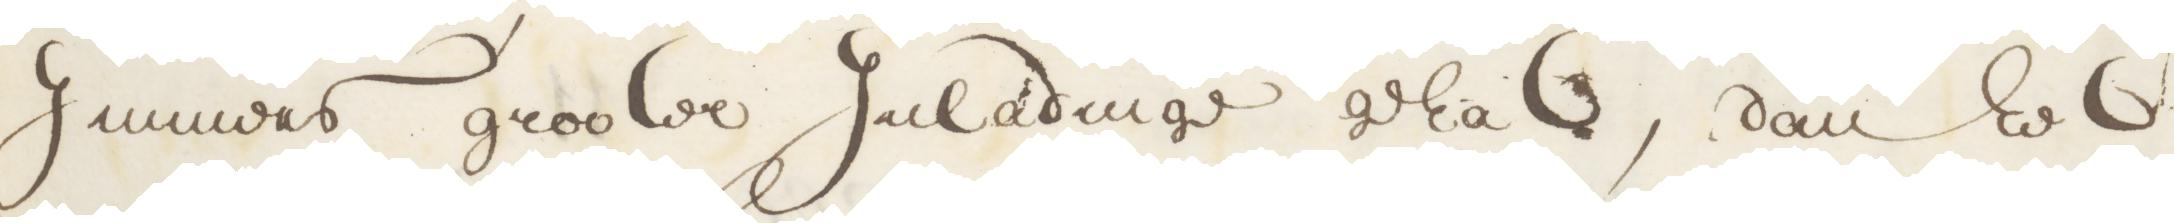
Jmmers grooter Jnladinge gehat, dan het
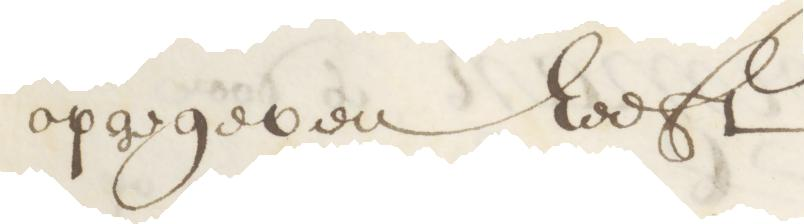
opgegeven heeft
